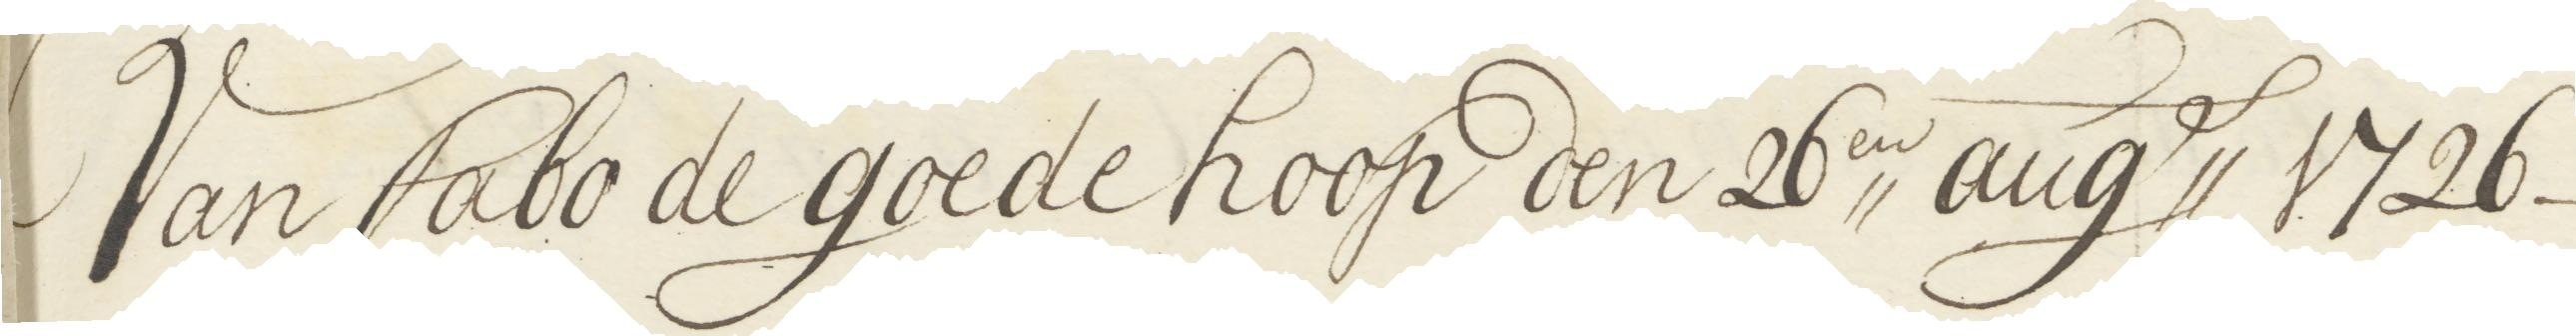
Van Cabo de goede hoop den 26„en aug„s 1726—
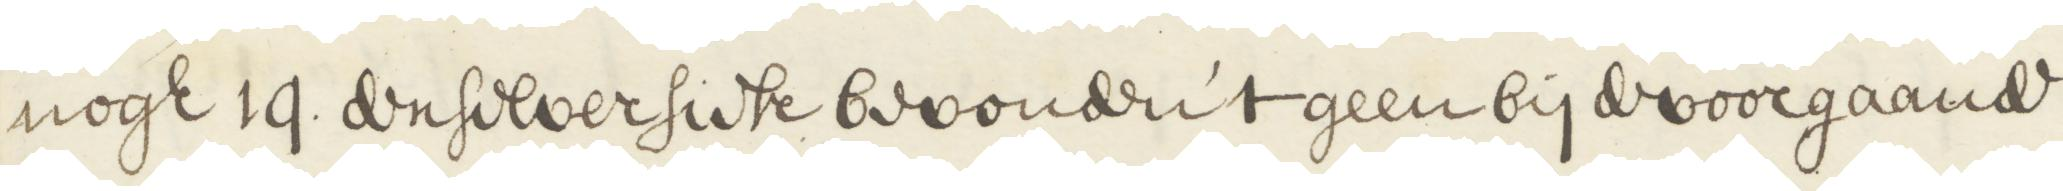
nogh 14. derselver siek bevonden ’t geen bij de voorgaande
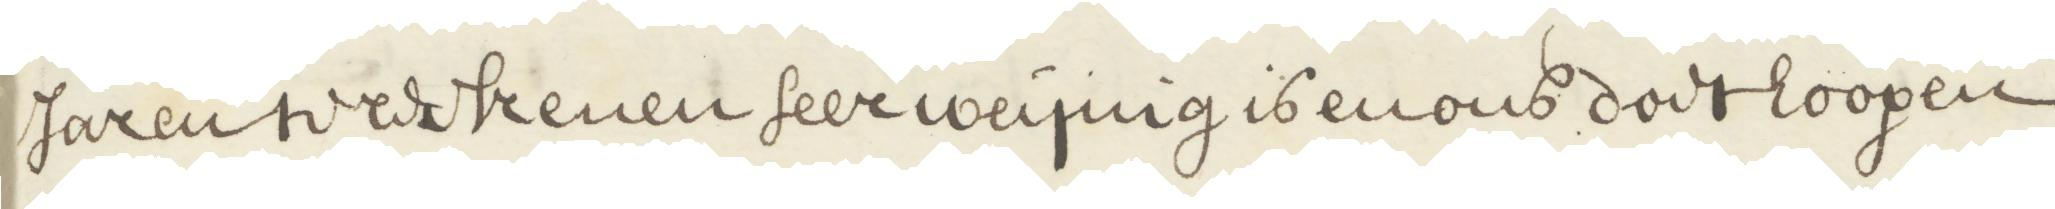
Jaren te reekenen seer weijnig is en ons doet hoopen
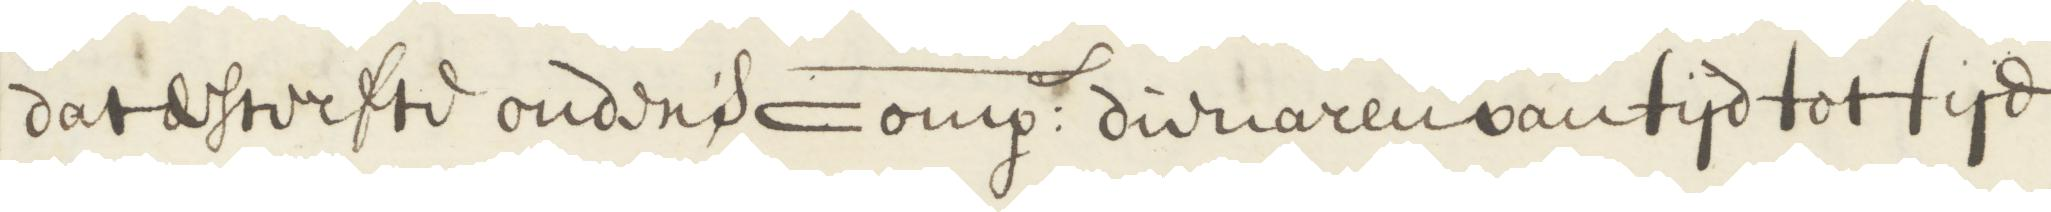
dat de sterfte onder 'scomp:s dienaren van tijd tot tijd
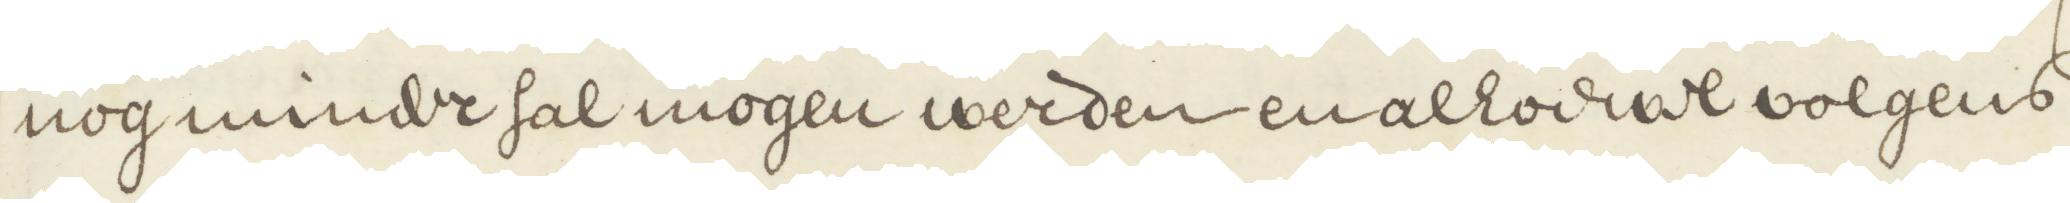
nog minder sal mogen werden en alhoewel volgens
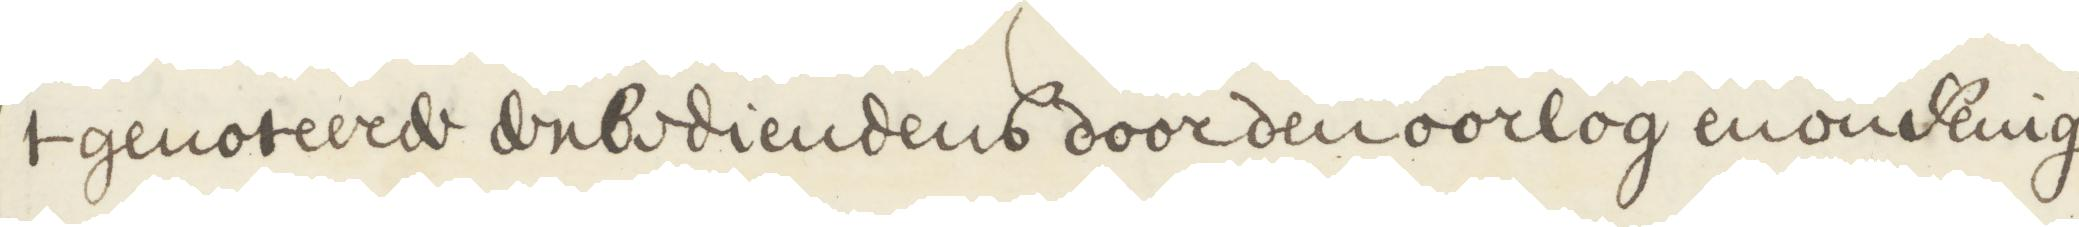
't genoteerde der bediendens door den oorlog en onEenig
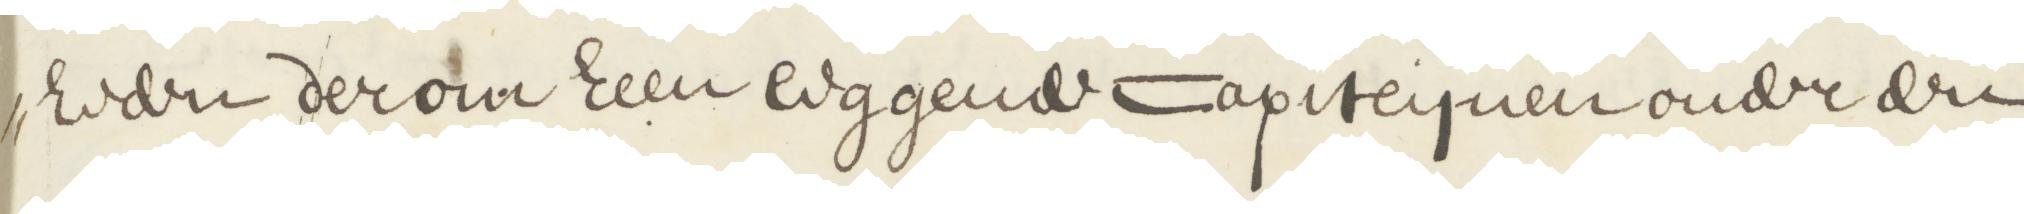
„heden der om heen leggende capiteijnen onder den
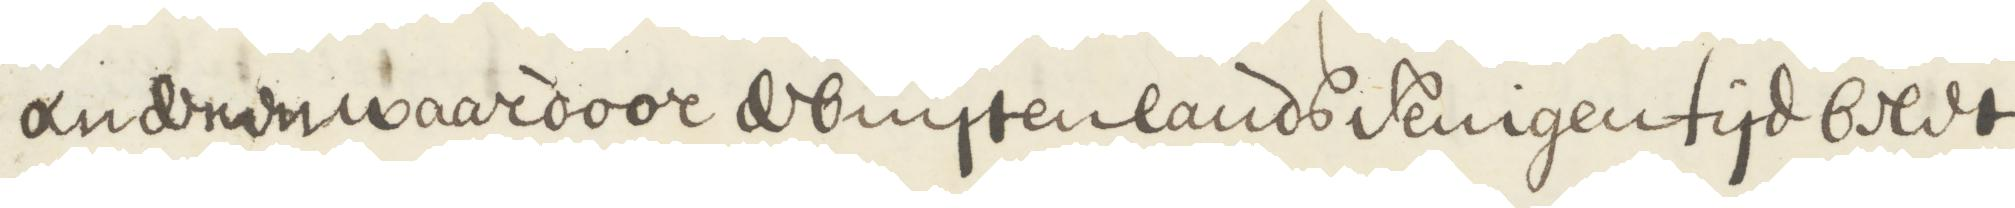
anderen waardoor de buijtenlands Eenigen tijd belet
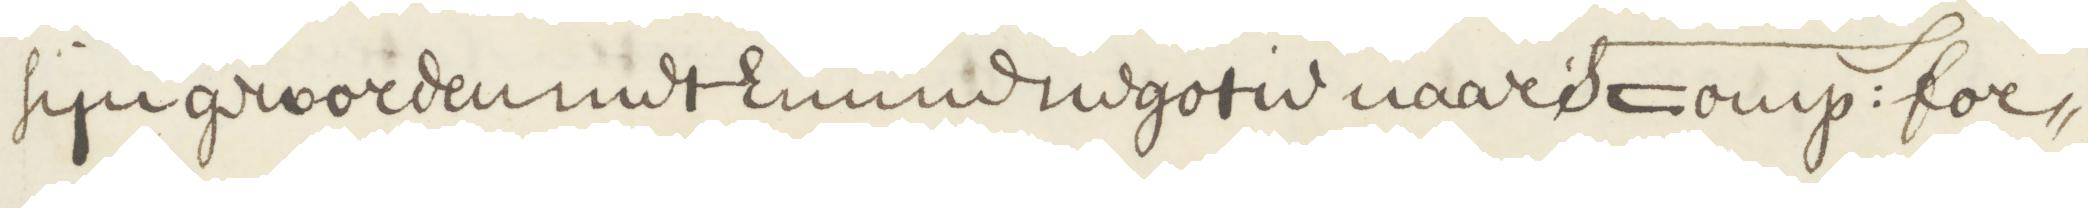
sijn geworden met hunne negotie naar ’s comp:s for„
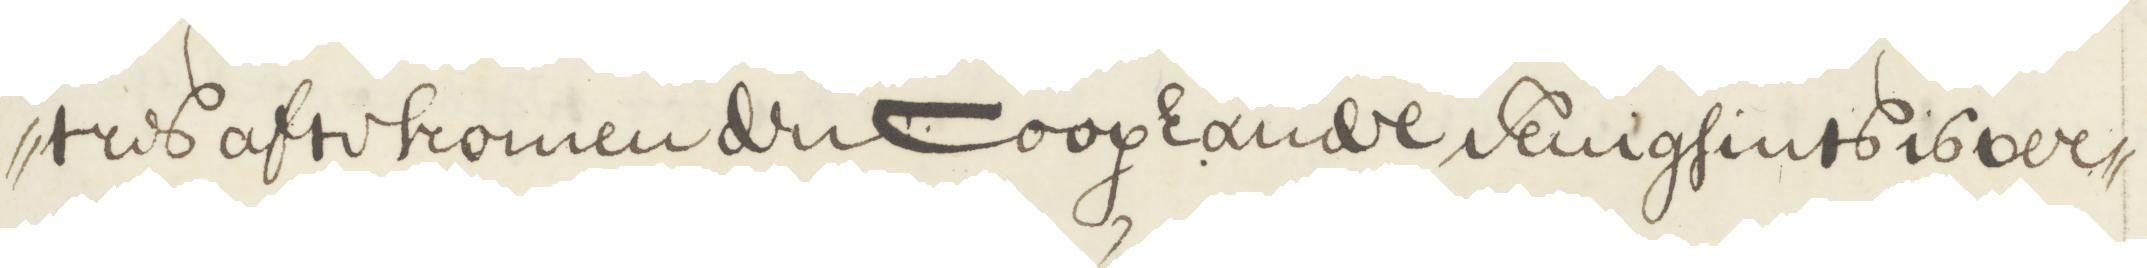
„tres afte komen den Coophandel Eenigsints is ver„
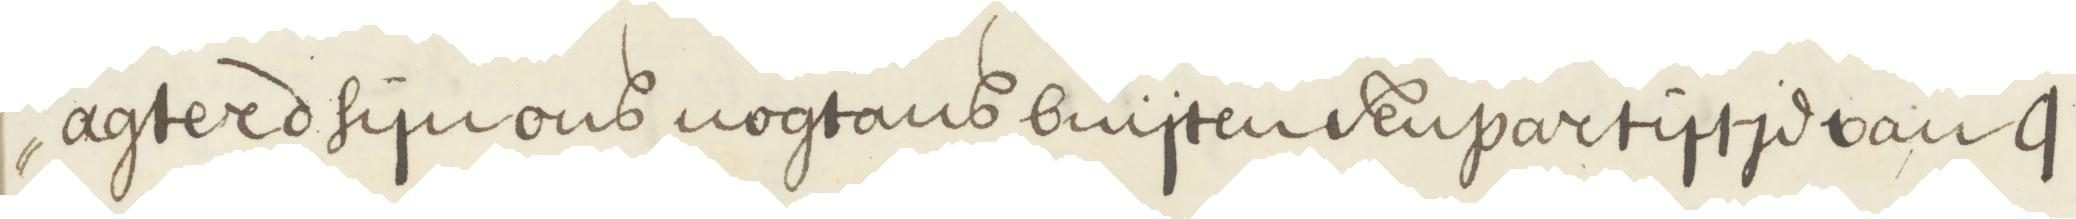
„agterd sijn ons nogtans buijten Een partijtje van 4
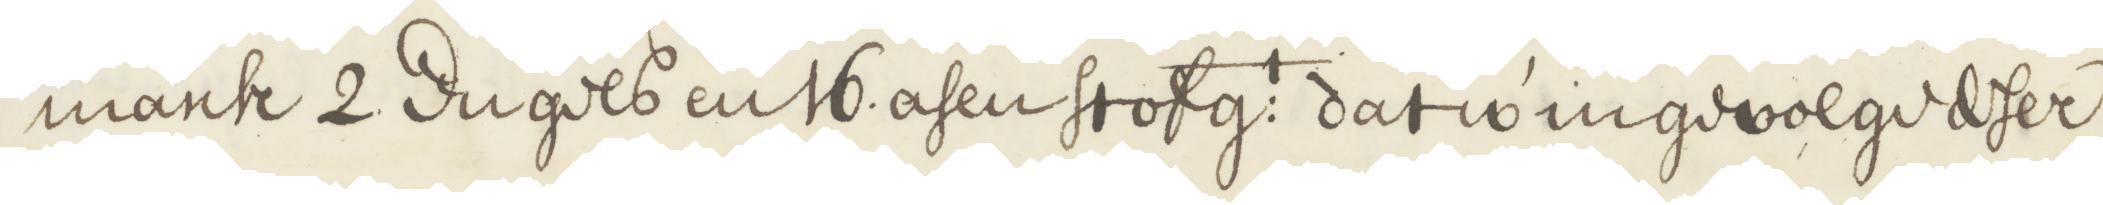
mank 2. Engels en 16. asen stofg:t dat w'ingevolge deser
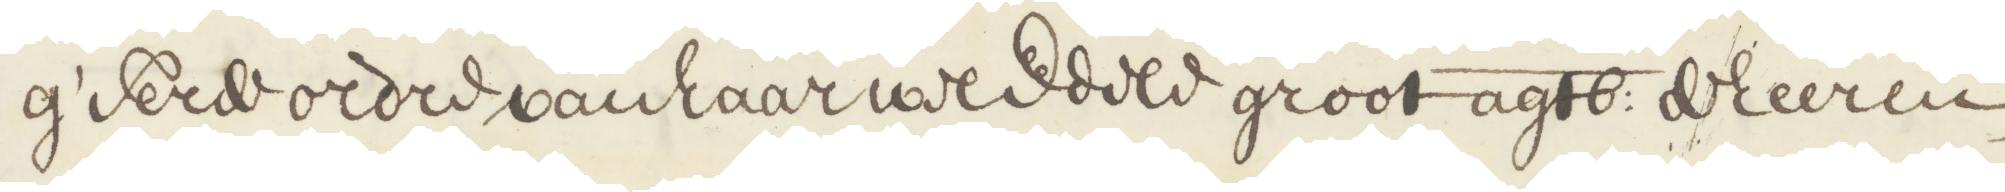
g’Eerde ordre van haar wel Edele groot agtb: de heeren
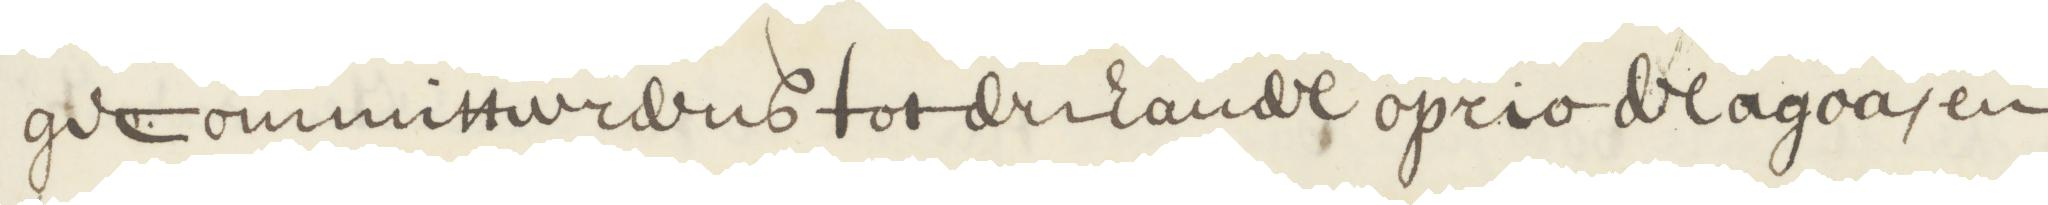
gecommitteerdens tot den handel op rio delagoa, en
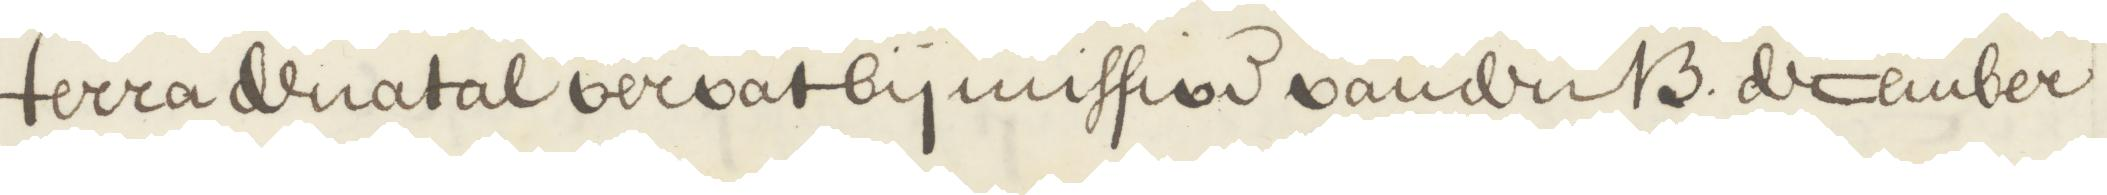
terra de natal vervat bij missive van den 13. december
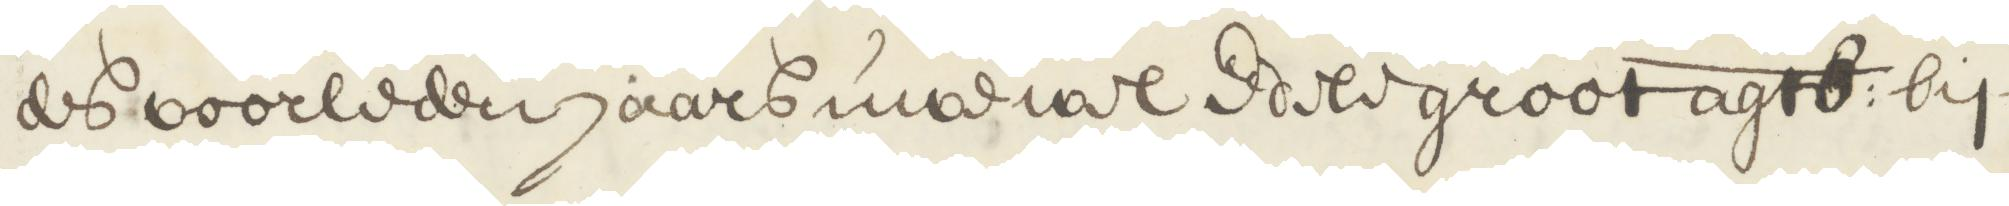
des voorleden jaars uwe wel Edele groot agtb: bij
